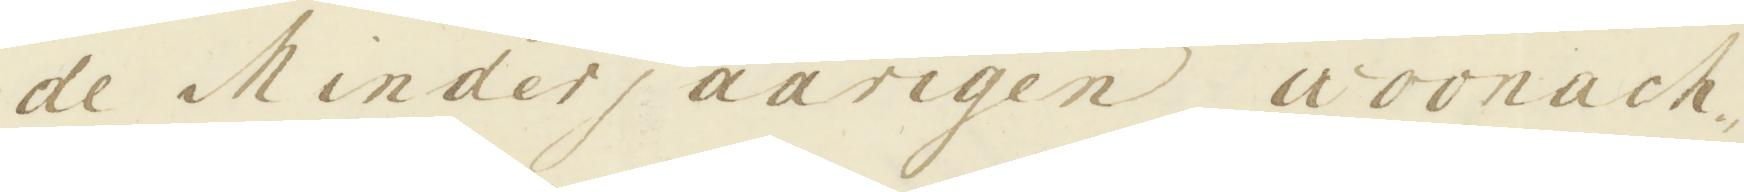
de Minderjaarigen woonach„
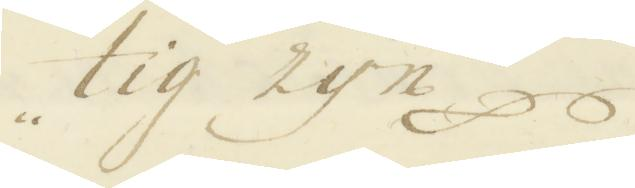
„tig zyn
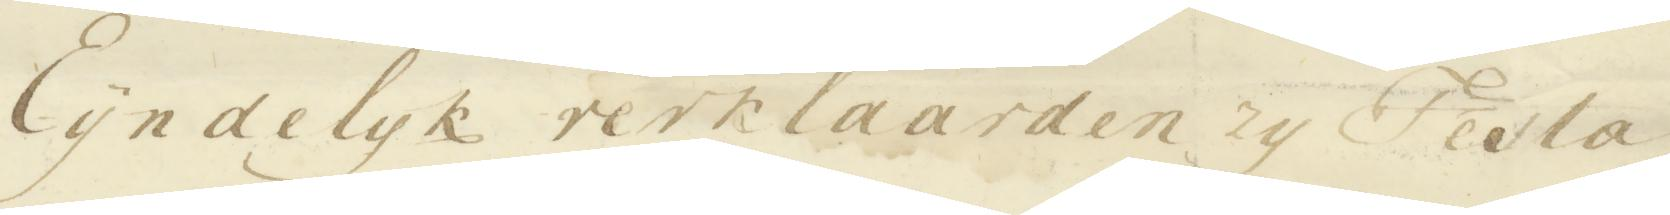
Eijndelyk verklaarden zy Testa
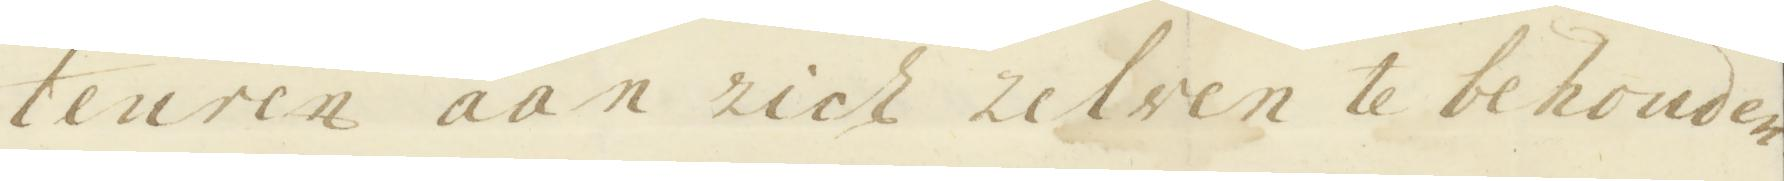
teuren aan zich zelven te behouden
